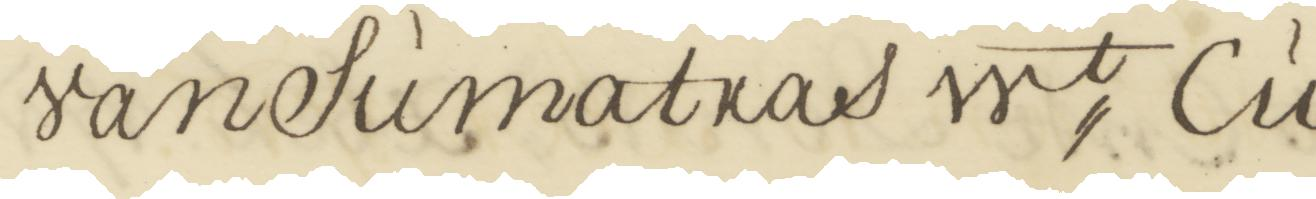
van Sumatras W„t Cust den 13. xber 1718.
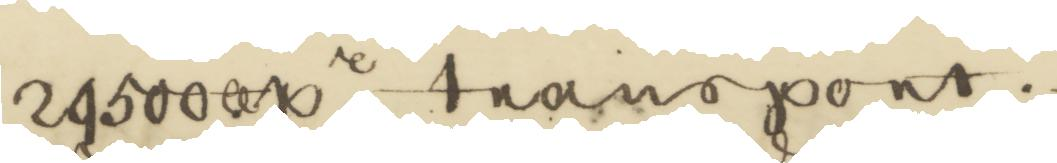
24500 lb p„r transport.
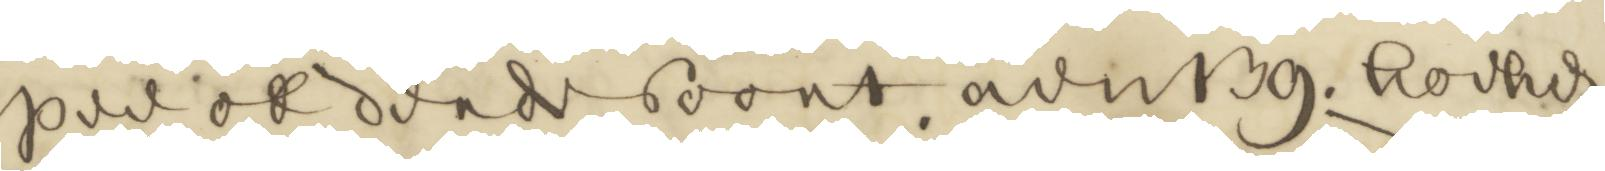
pee of derde soort, aen 139. hoeken
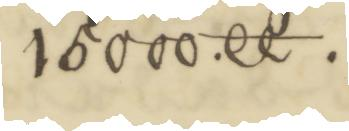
15000. lb.
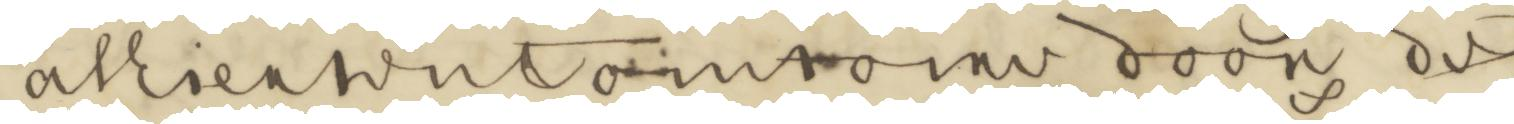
alhier ten Comtoire door de
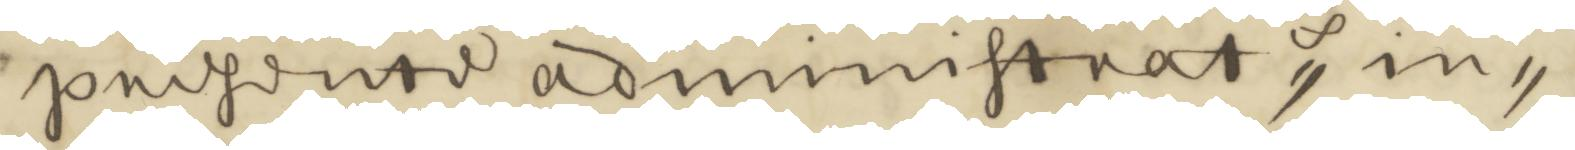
presente administrat„s in„
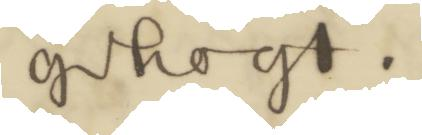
gekogt.
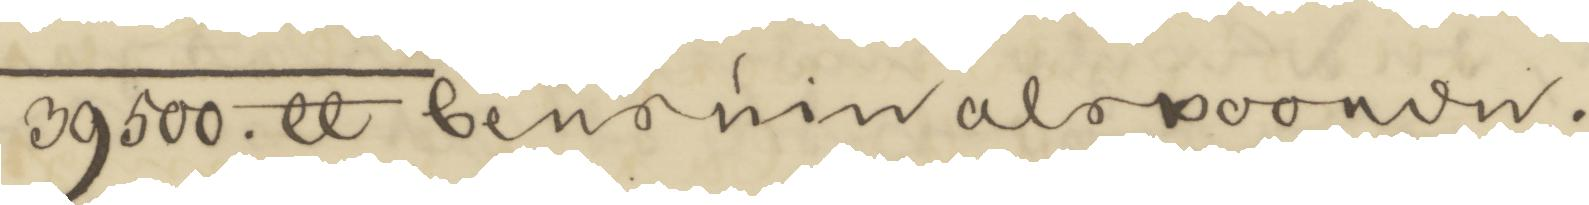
39500. lb bensuin als vooren.
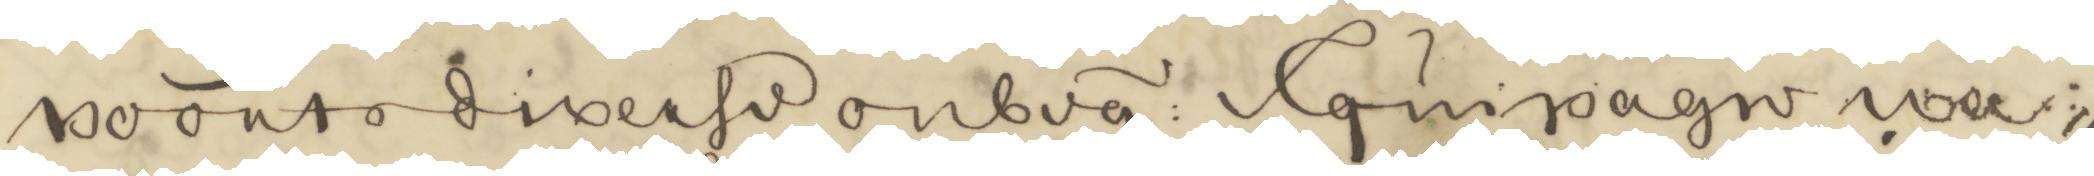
voorts diverse onbeq: Equipagie wa„
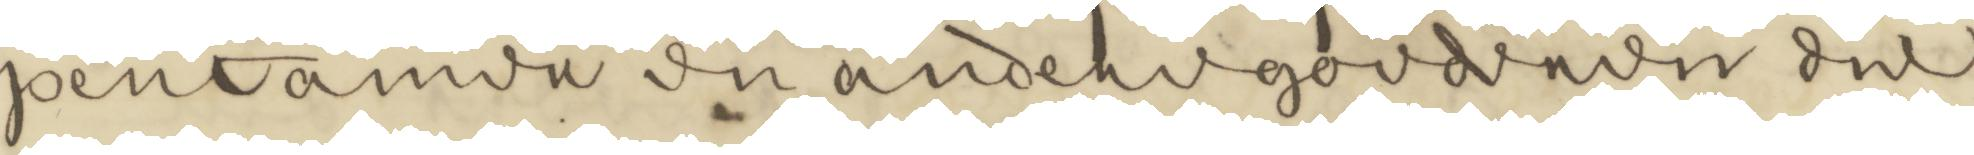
pencamer en andere goederen die
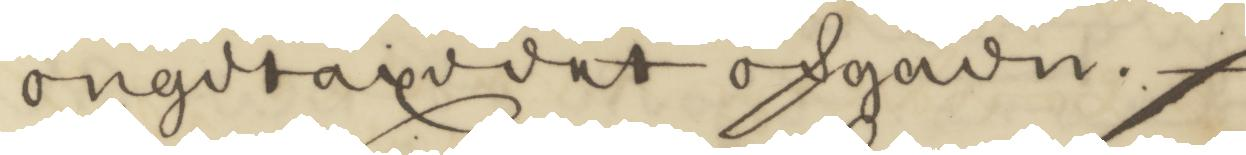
ongetaxeert overgaen.
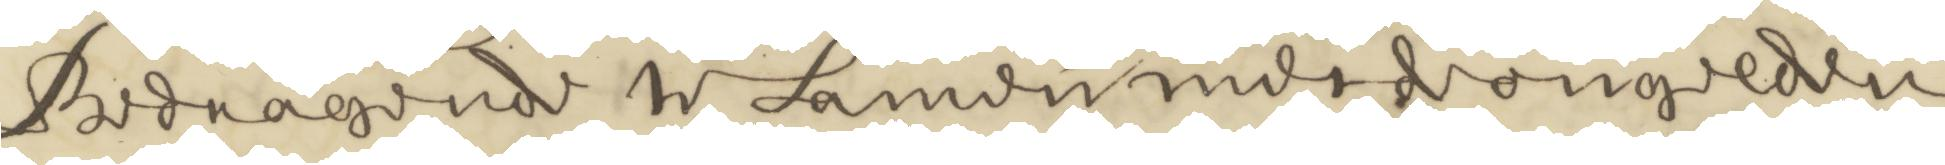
Bedragende te samen met de ongelden
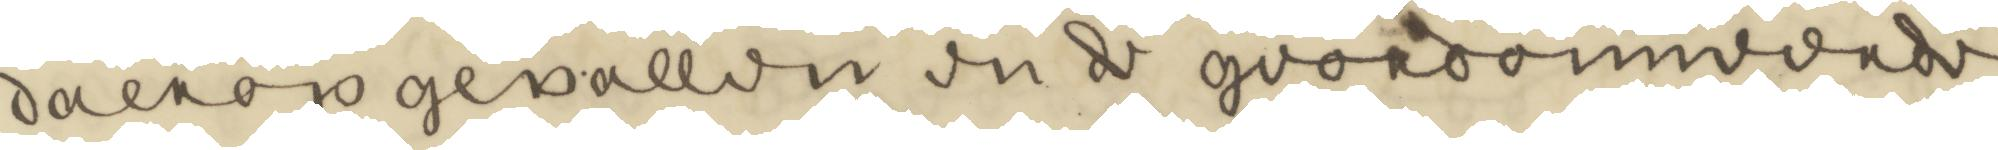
daerop gevallen en de geordonneerde
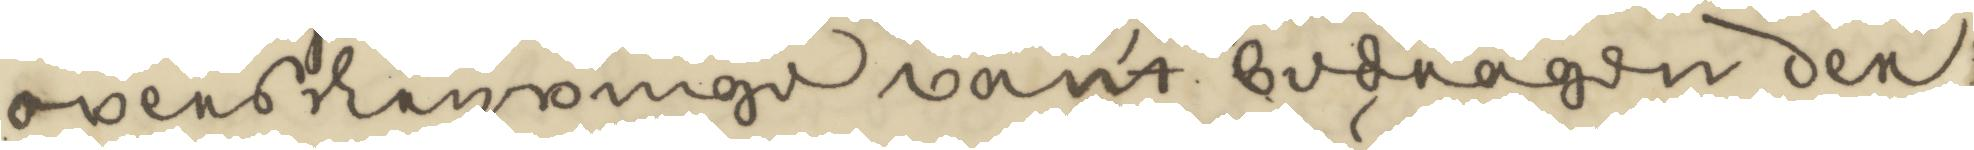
overschijvinge van’t bedragen der
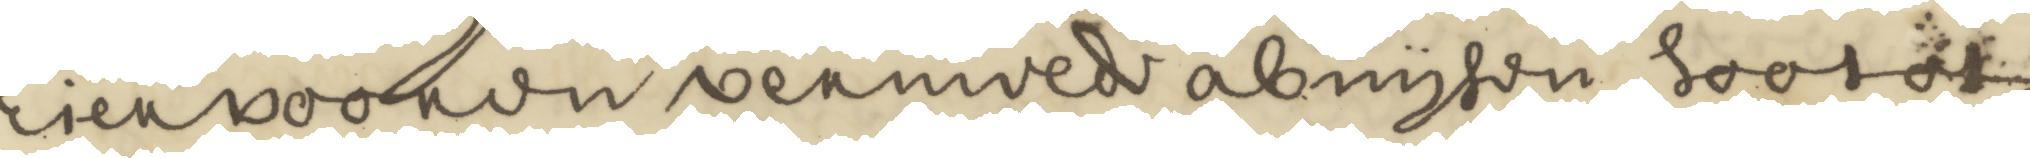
hiervooren vermelde abuijsen soo tot
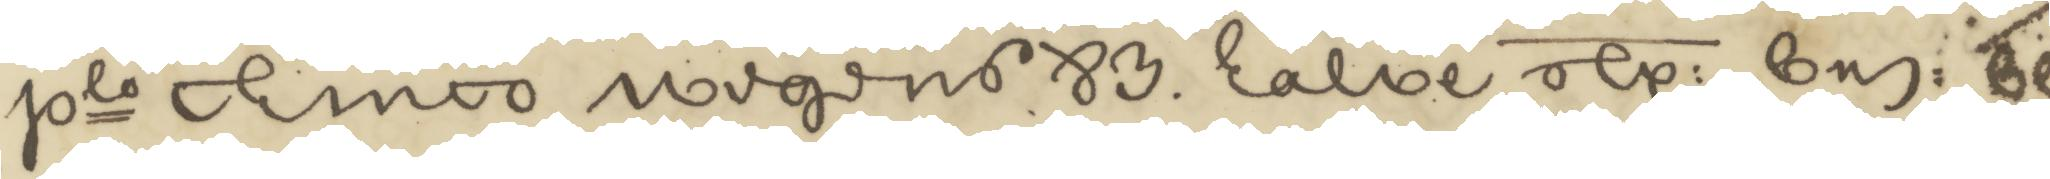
p=lo Chinco wegens 83. halve slx: br: be
